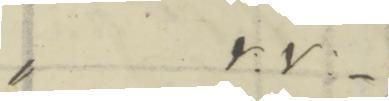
„ 1:1:—
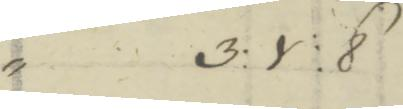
„ 3:1:8
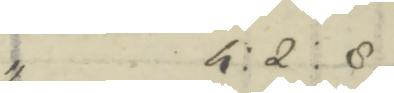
„ 4:2:8
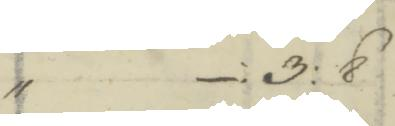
„ —:3:8
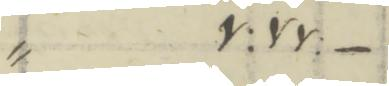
„ 1:11:—
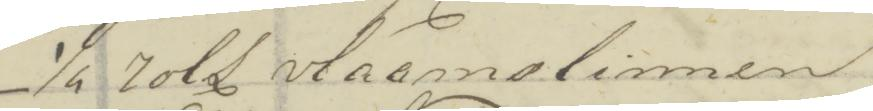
—¼ roll vlaams linnen
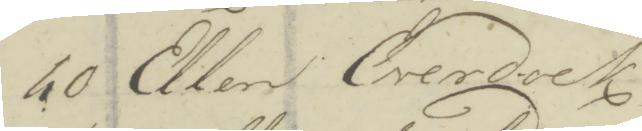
40 Ellen Everdoek
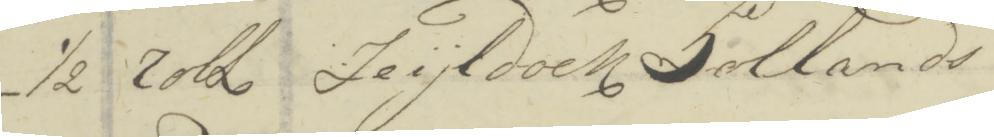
—½ roll Zeijldoek Hollands
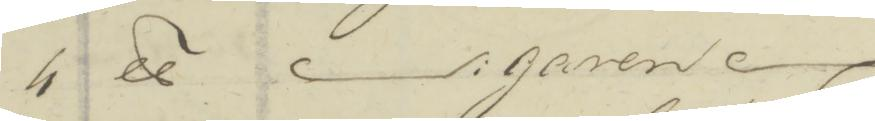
„ lb —: garen —:
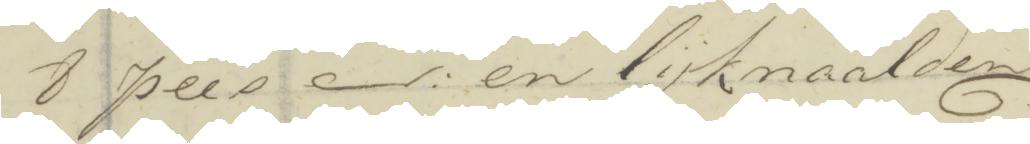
8 pees —: en lijknaalden
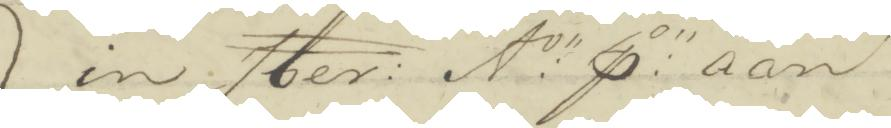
in 7ber: A:o p:o„ aan
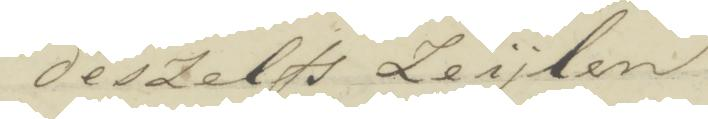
deszelfs Zeijlen
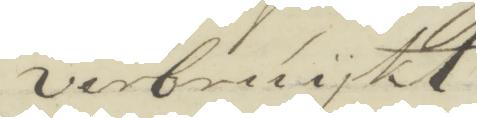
verbruijkt
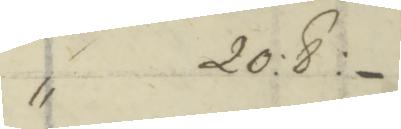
„ 20:8:—
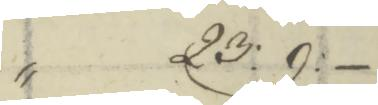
„ 23: 9:—
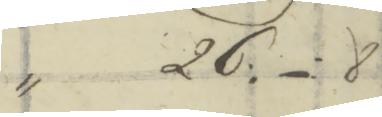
„ 26:—:8
